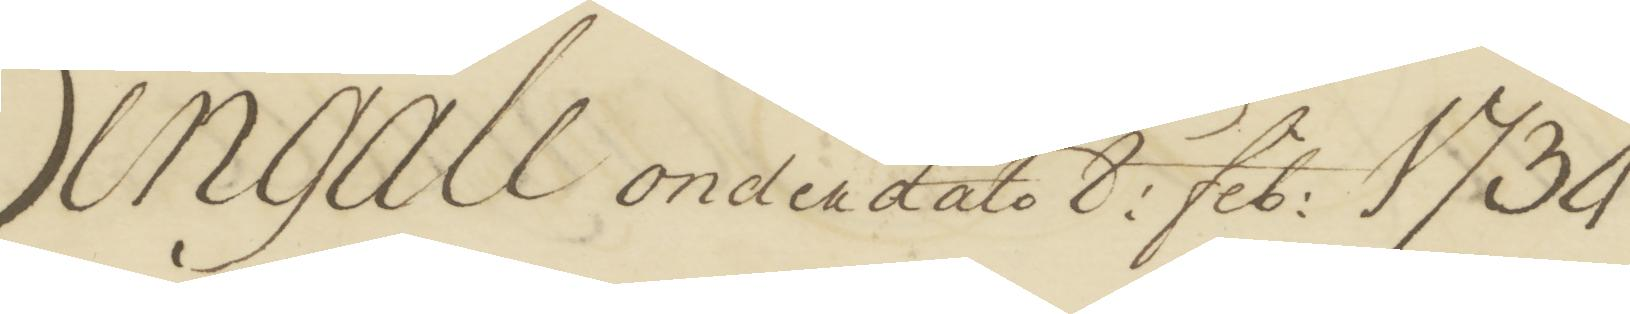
Van Bengale onder dato 8:' feb: 1734
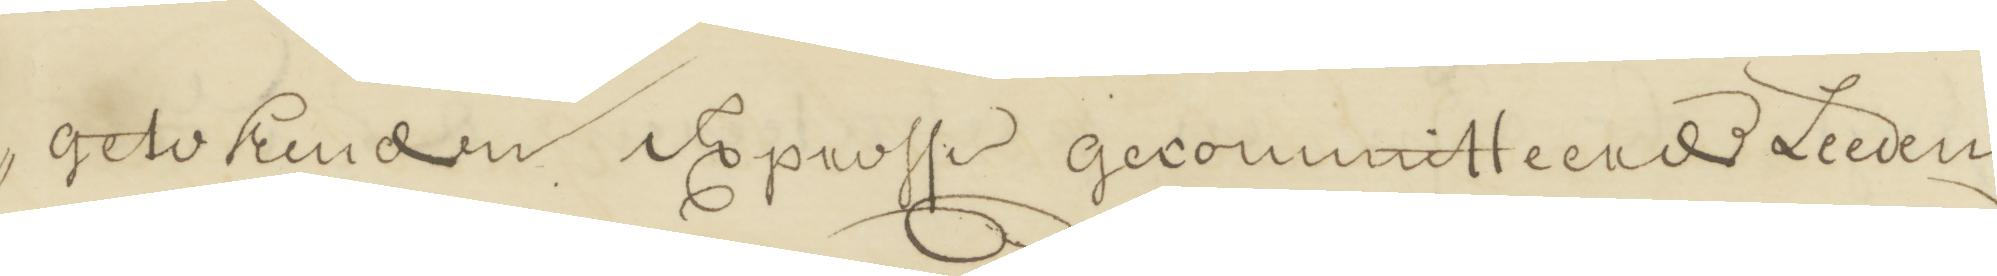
„getekenden Expresse gecommitteerde Leeden
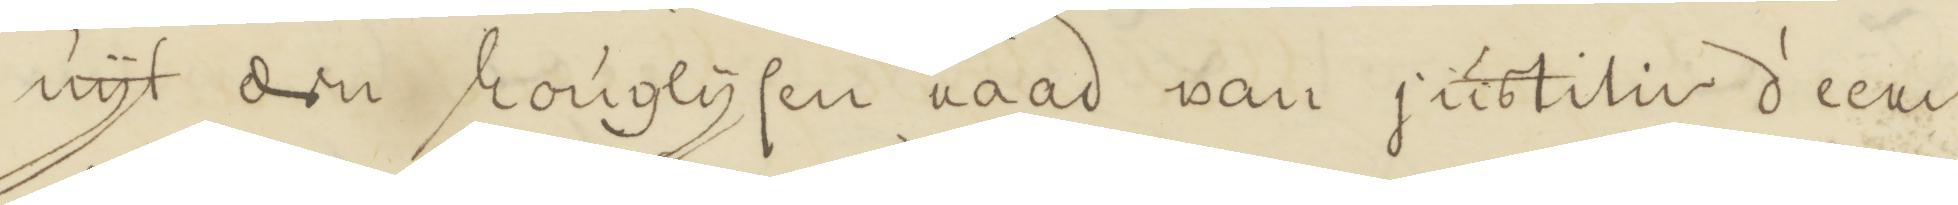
uijt den houglijsen raad van justitie d’eere
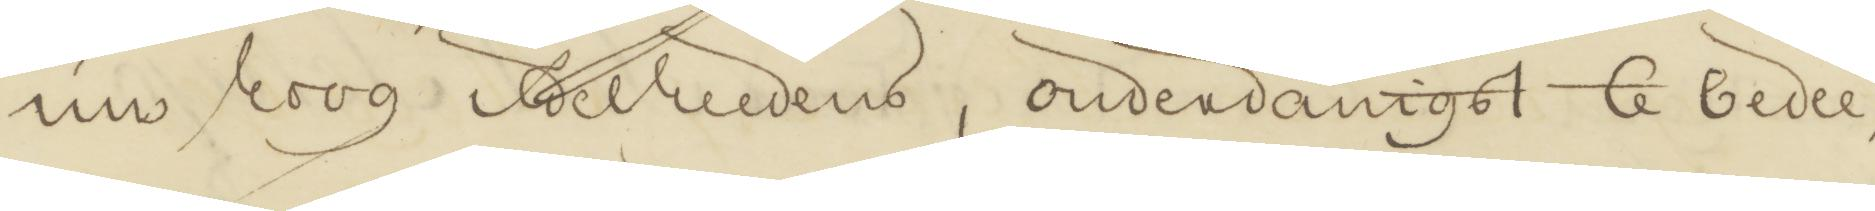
uw hoog Edelheedens, onderdanigst te bedee„
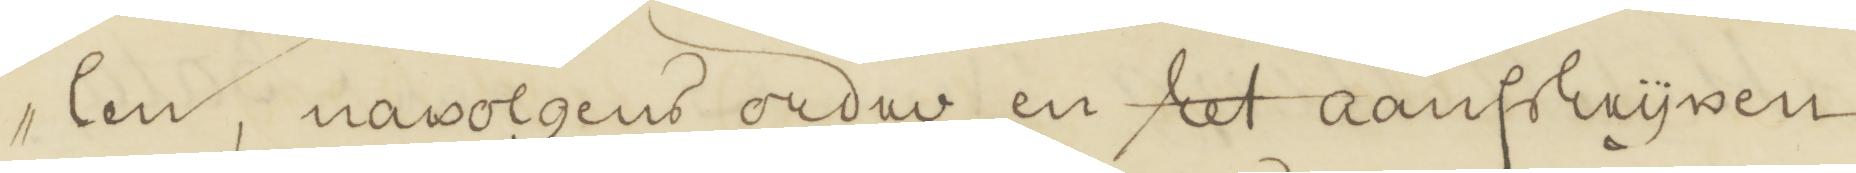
„len, navolgens ordre en het aanschrijven
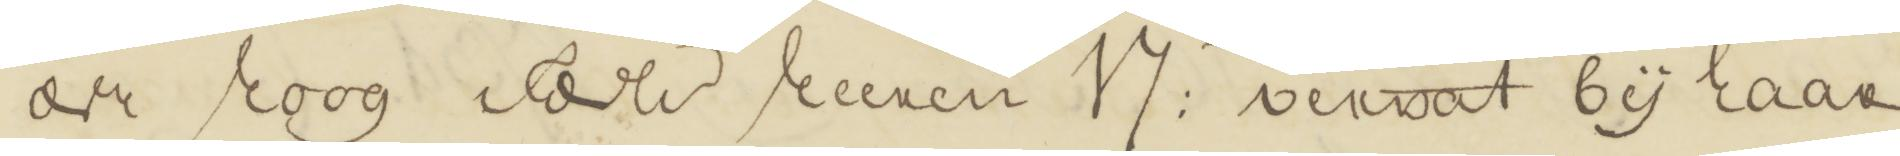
der hoog Edele heeren 17:' vervat bij haar
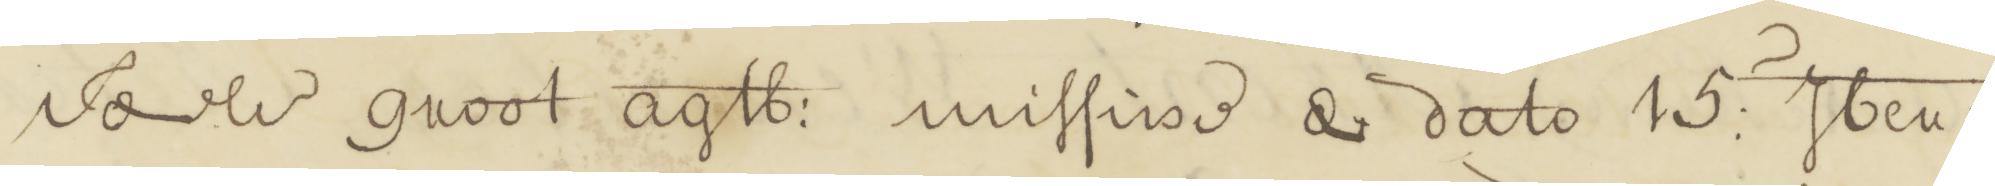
Edele groot agtb: missive de dato 15:' 7ber:
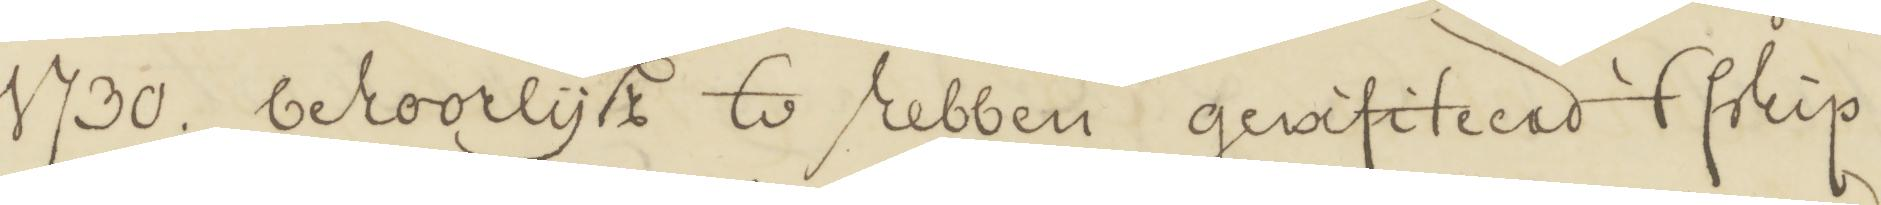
1730. behoorlijk te hebben gevisiteerd ’t schip
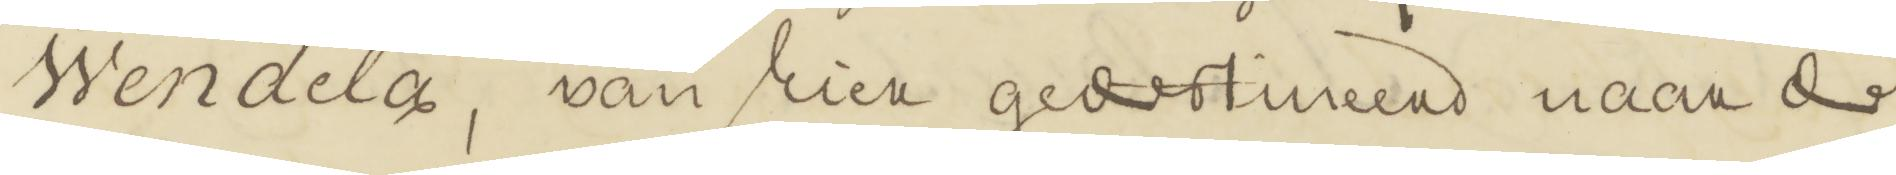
Wendela, van hier gedestineerd naar de
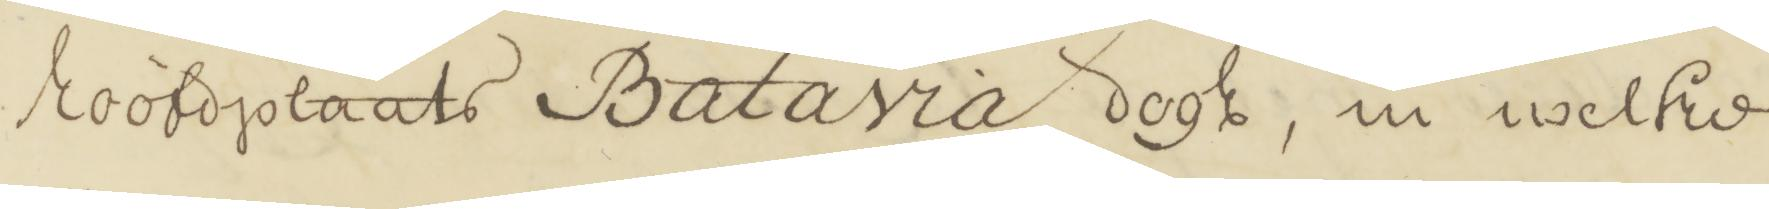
hoofdplaats Batavia dogh, in welke
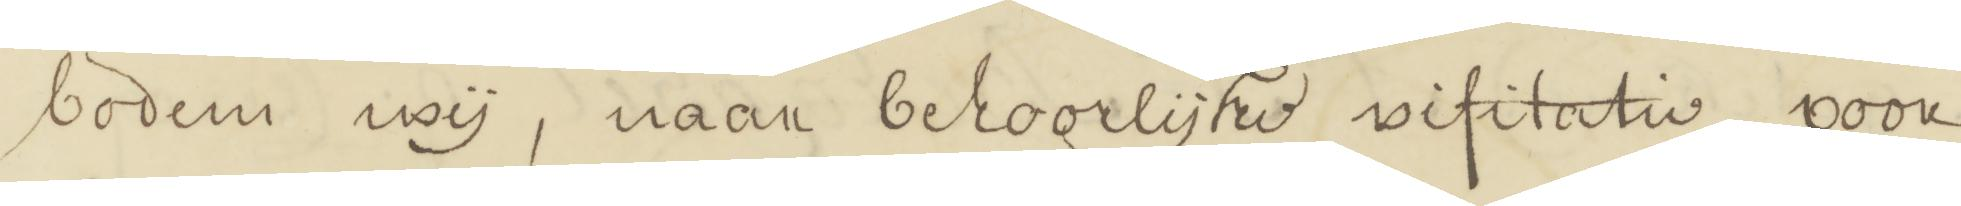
bodem wij, naar behoorlijke visitatie, voor
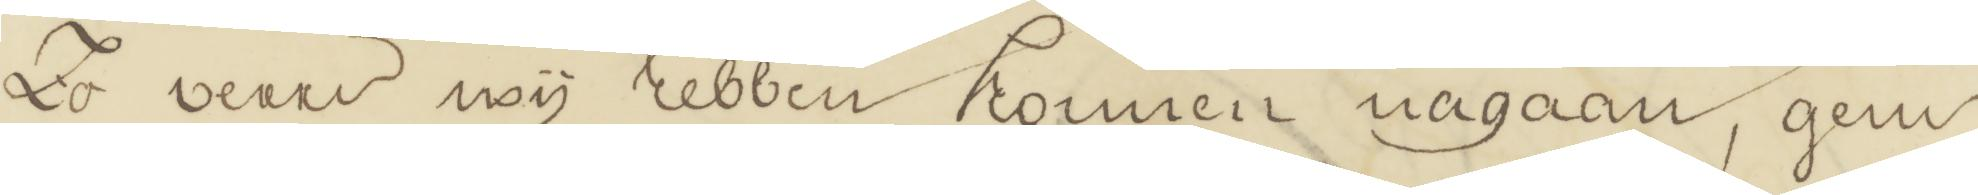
zo verre wij hebben konnen nagaan, gene
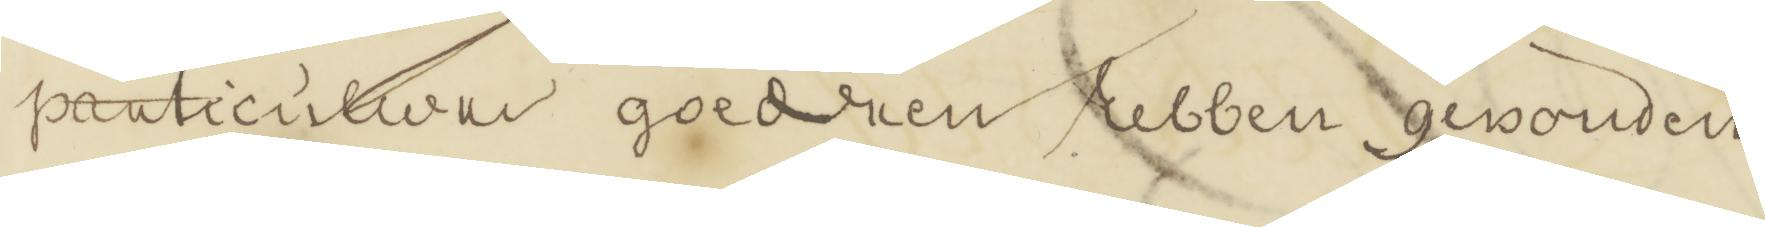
particuliere goederen hebben gevonden,
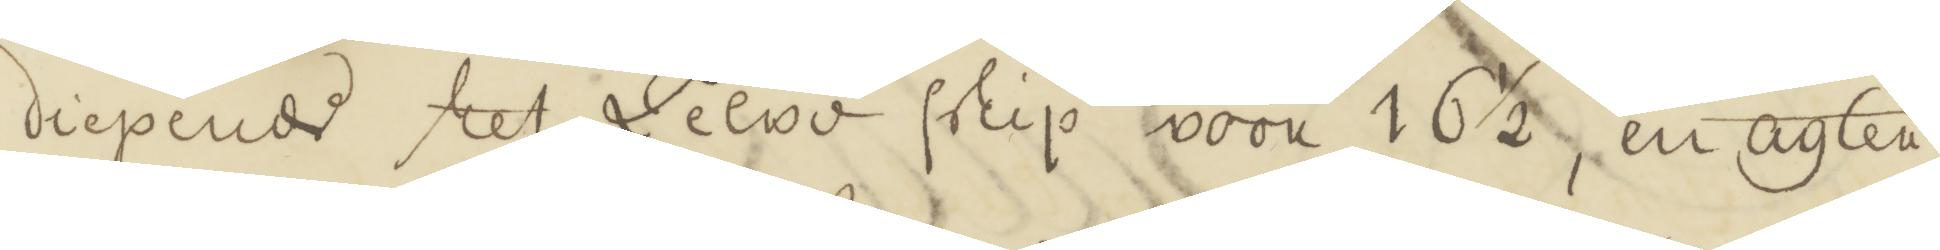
diepende het zelve schip voor 16½, en agter
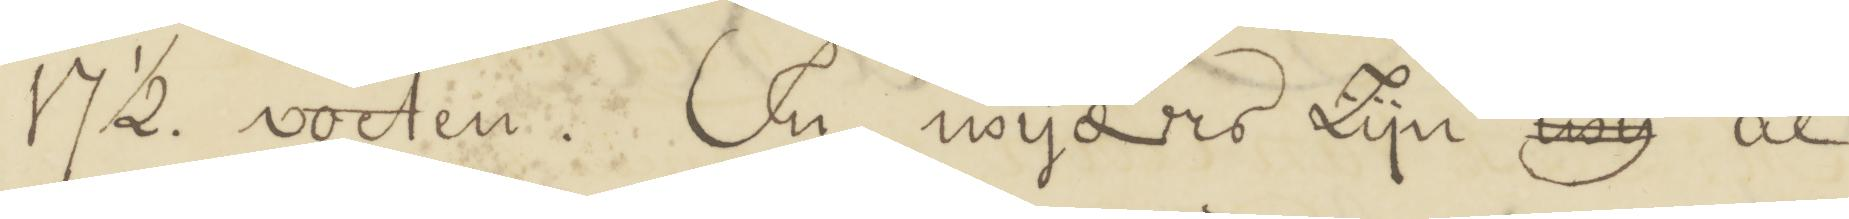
17½. voeten. En wijders zijn wij al
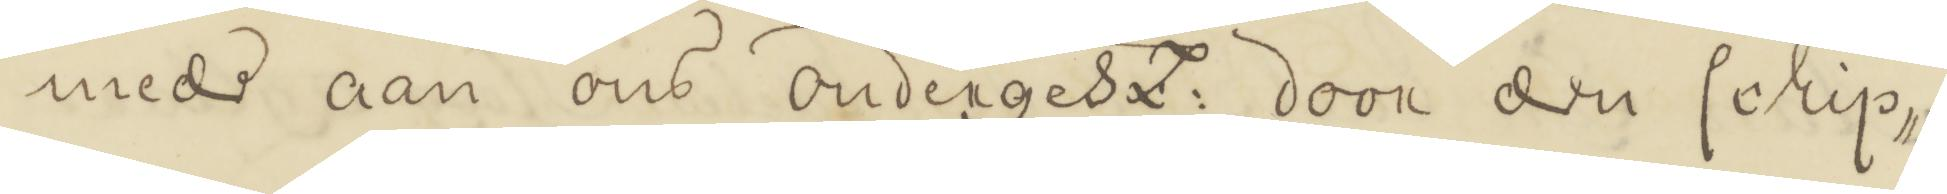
mede aan ons ondergesz: door den schip„
